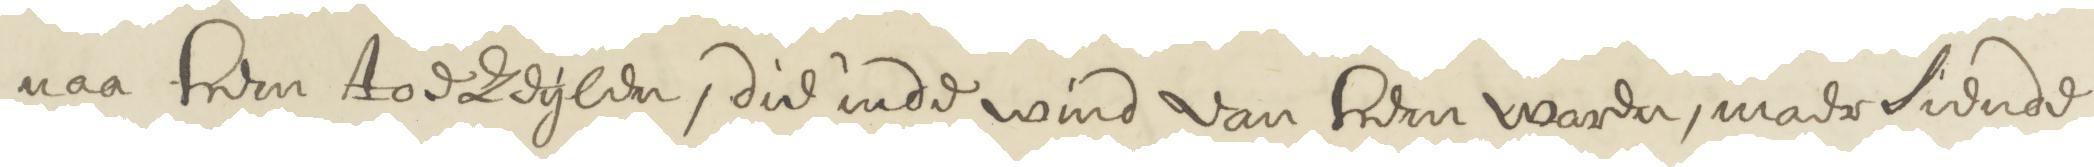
naa hem toezeijlen, die inde wind van hem waren, maer siende
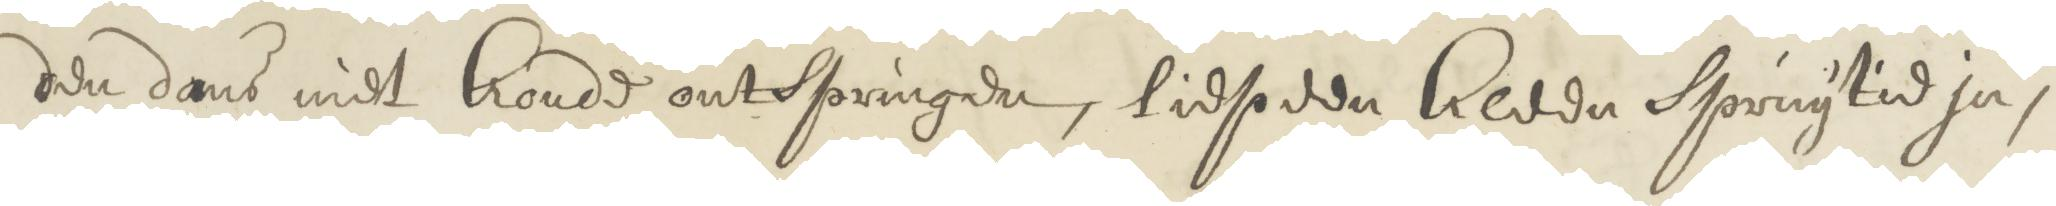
den dans niet konde ontspringen, liep een kleen spruijtie in,
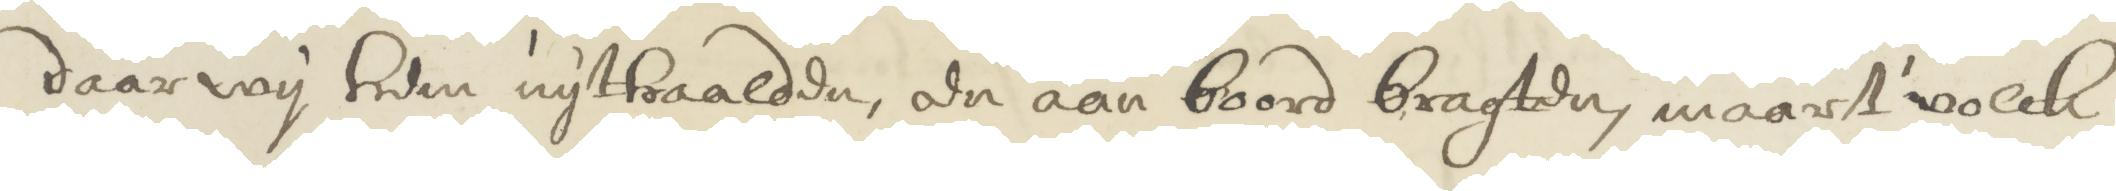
daar wij hem uijthaalden, en aan boord bragten, maar t' volck
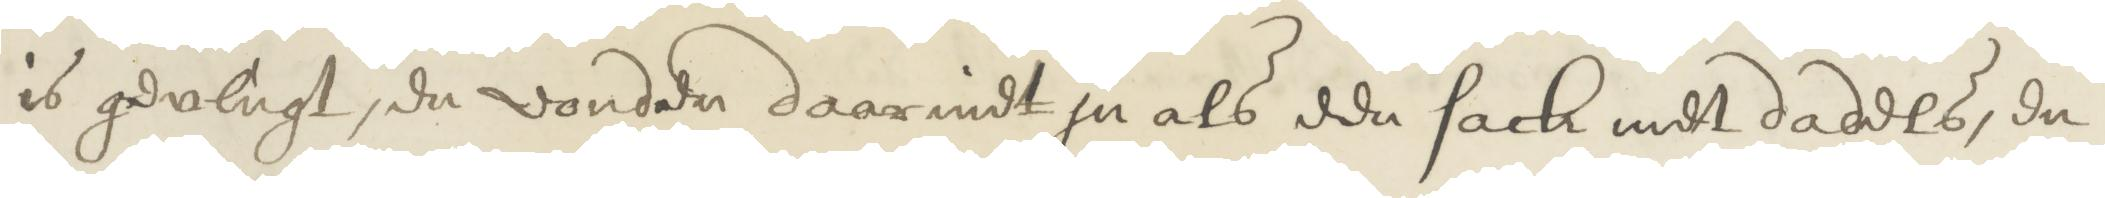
is gevlugt, en vonden daar niet in als een sack met dadels, en
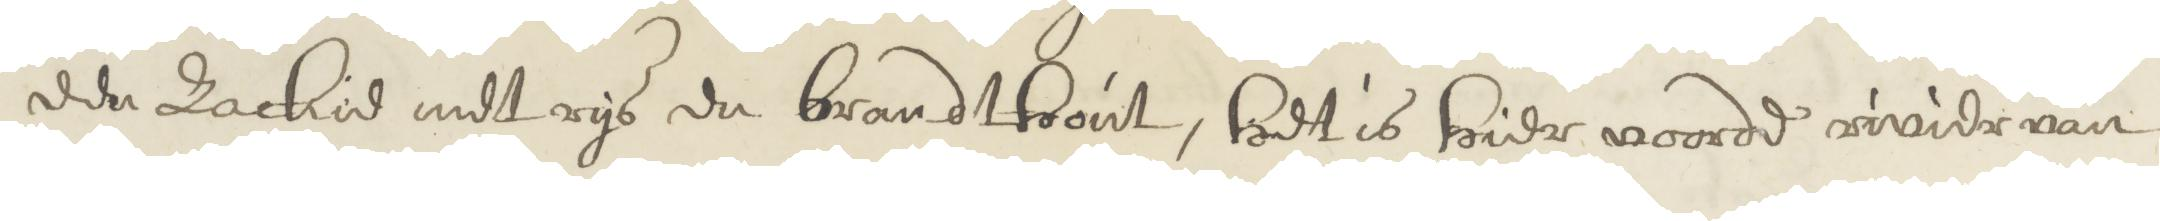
een zackie met rijs en brandthout, het is hier voorde rivier van
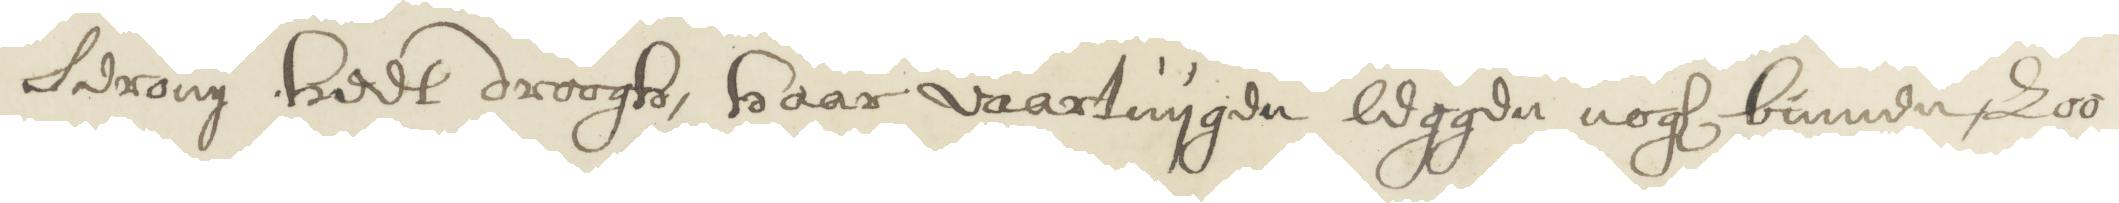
seronij heel droogh, haar vaartuijgen leggen nogh binnen, zoo
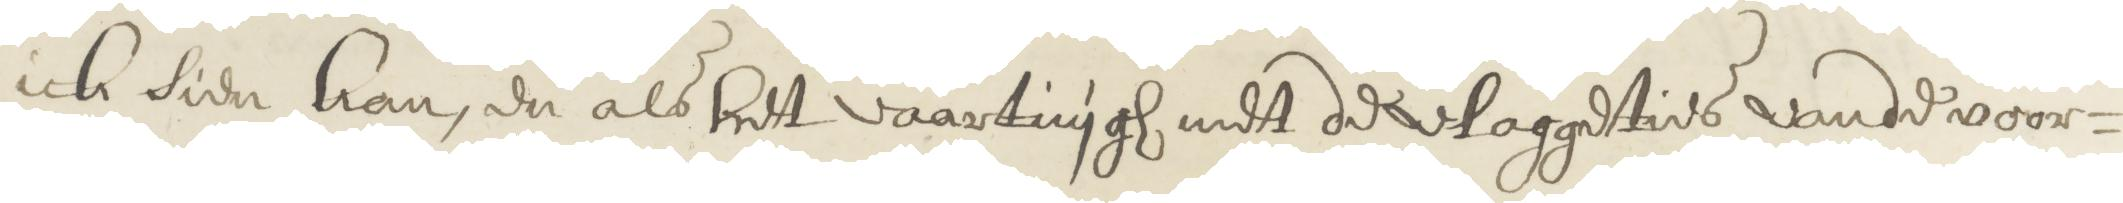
ick sien kan, en als het vaartuijgh met de vlaggeties vande voor=
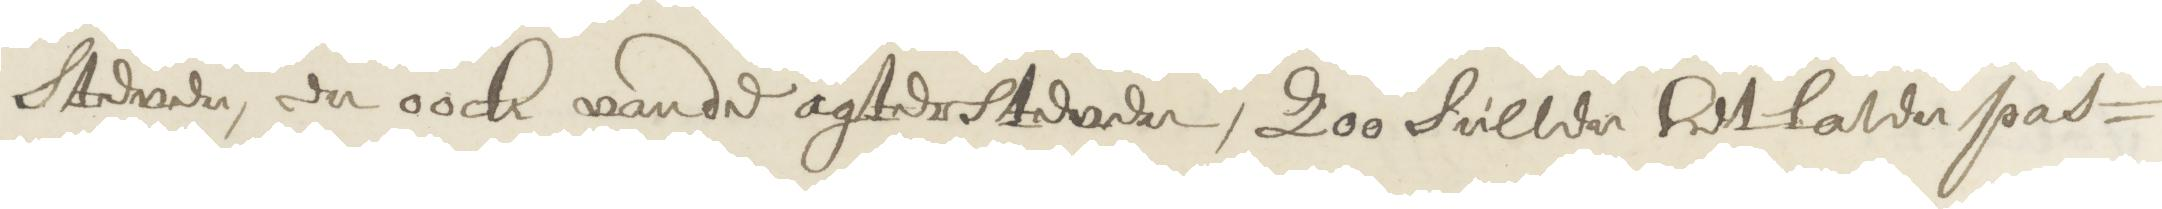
steven, en oock vande agtersteven, zoo sullen het laten pas=
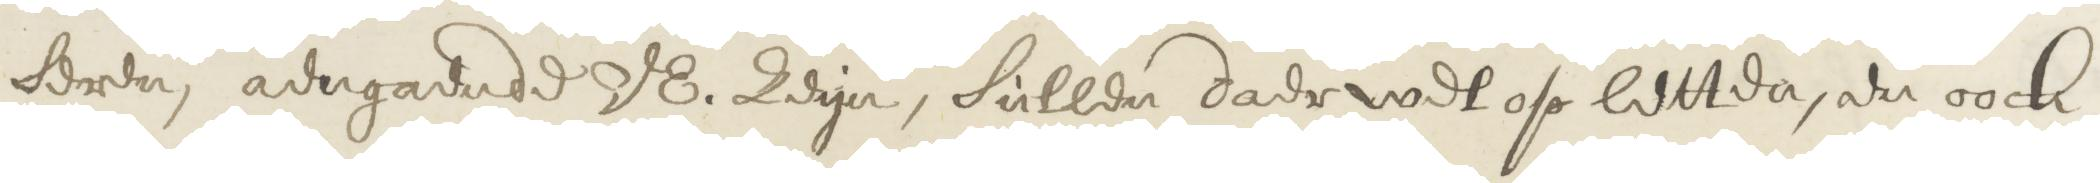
seren; aengaende UE. zeijn, sullen daer wel op letten, en oock
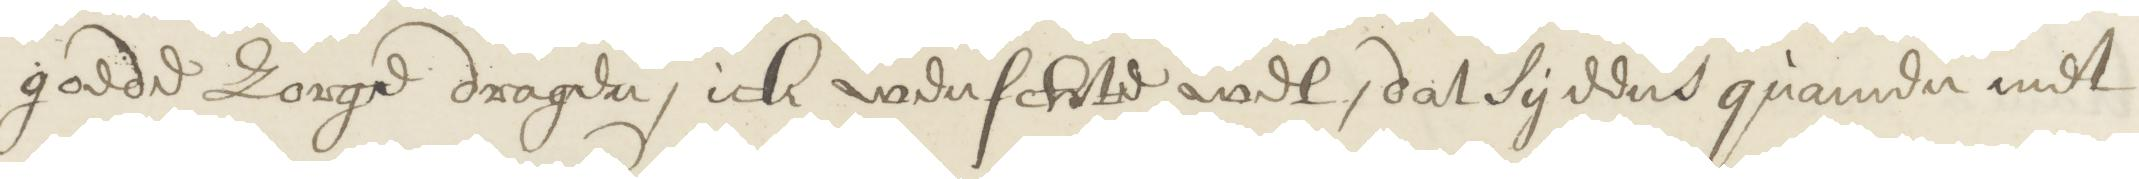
goede zorge dragen, ick wenschte wel, dat sij eens quamen met
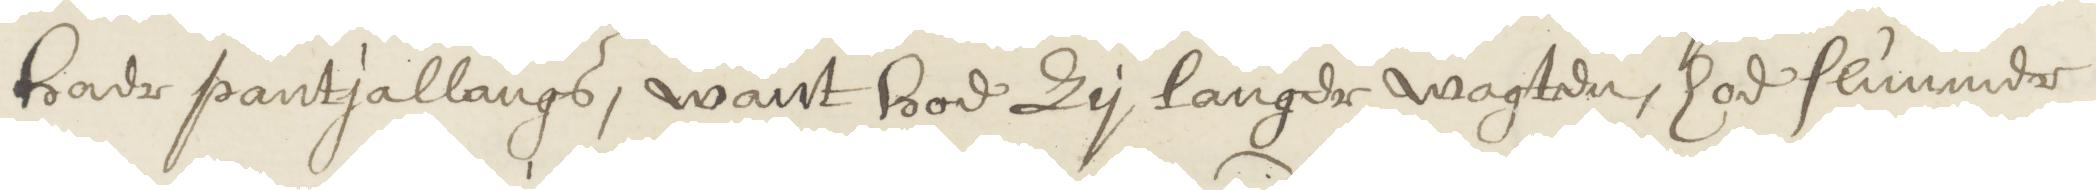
haer pantjallangs, want hoe zij langer wagten, hoe slummer
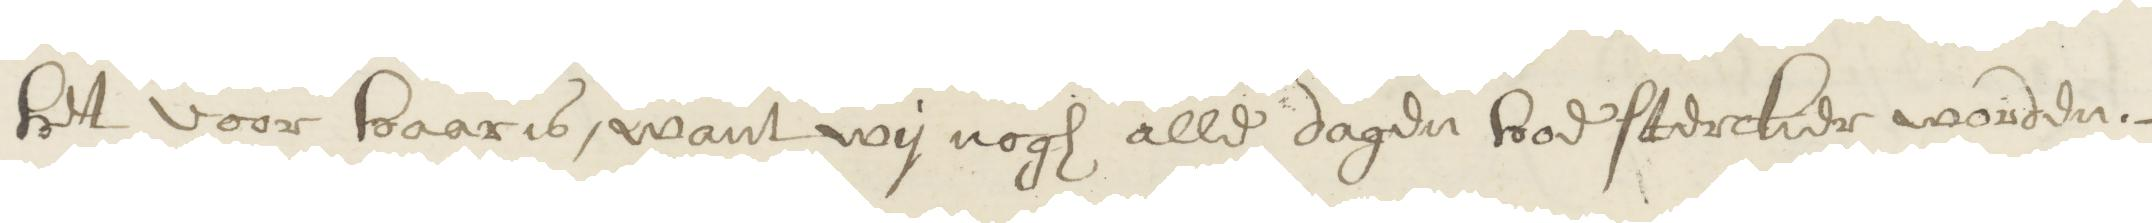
het voor haar is, want wij nogh alle dagen hoe stercker worden.
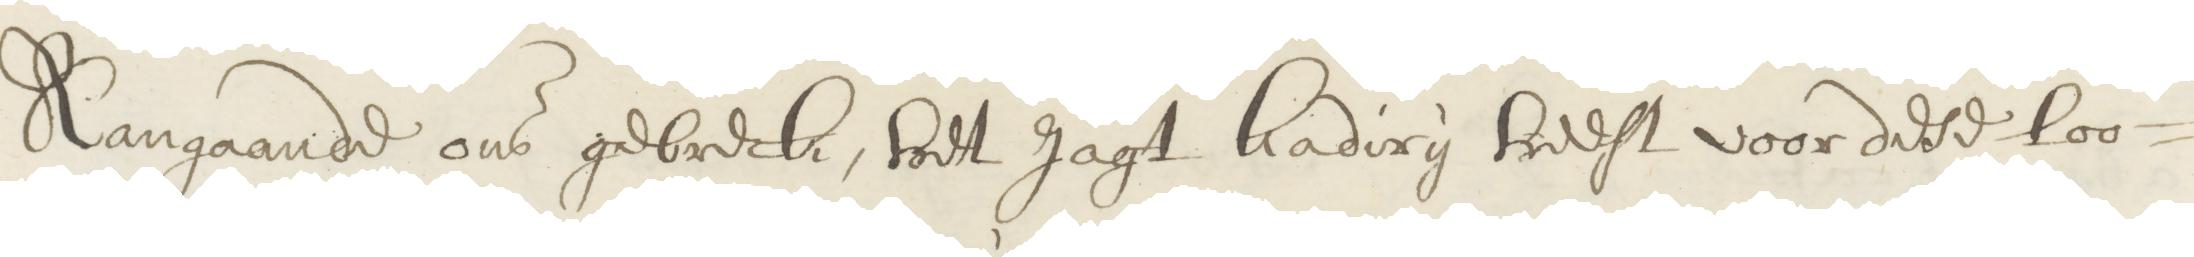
Aangaande ons gebreck, het Jagt kadirij heeft voor dese loo=
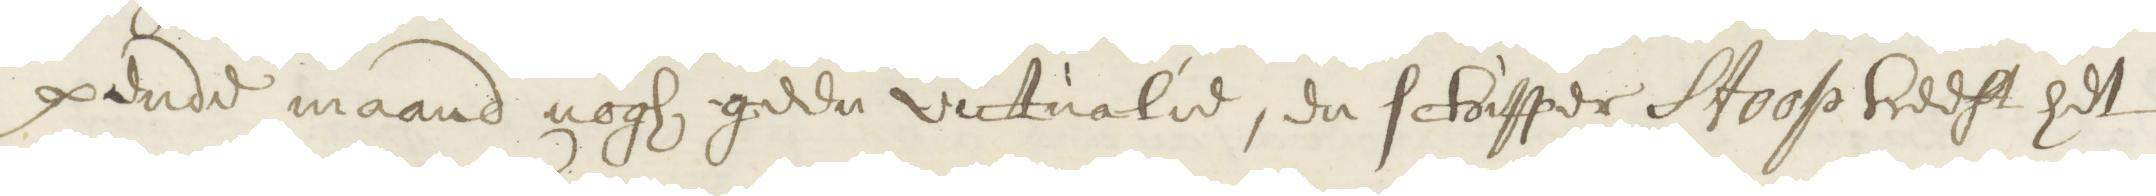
pende maand nogh geen victualie, en schipper stoop heeft het
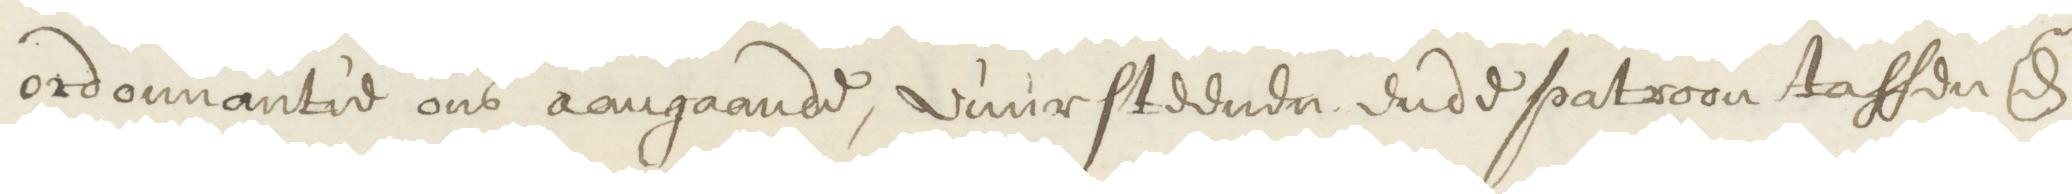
ordonnantie ons aangaande, vuursteenen ende patroon tassen ende
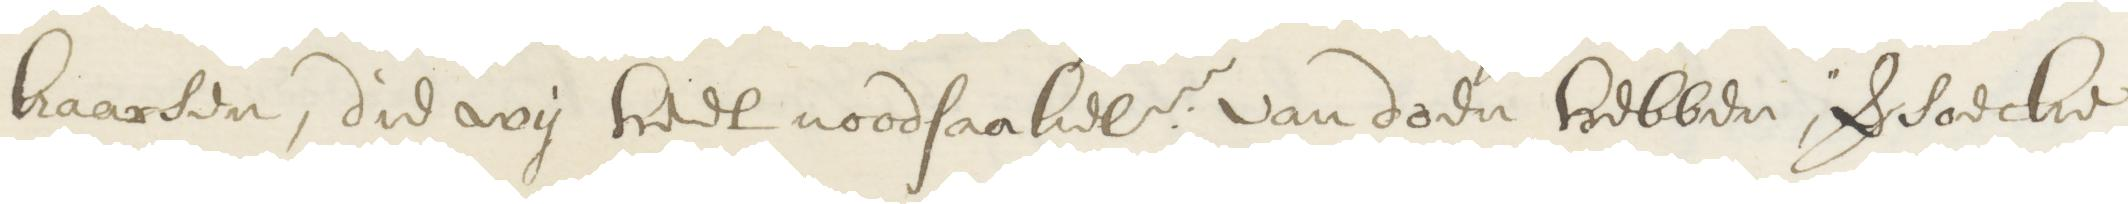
kaarsen, die wij heel noodsaakel: van doen hebben; versoecke
